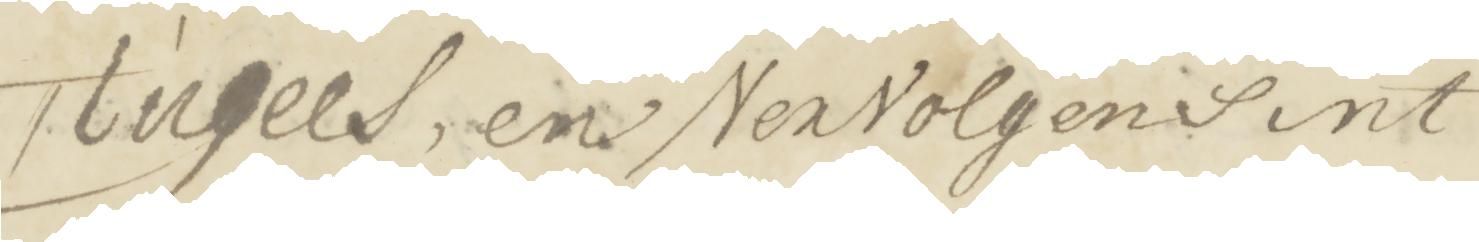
„tugees, en Vervolgens in't
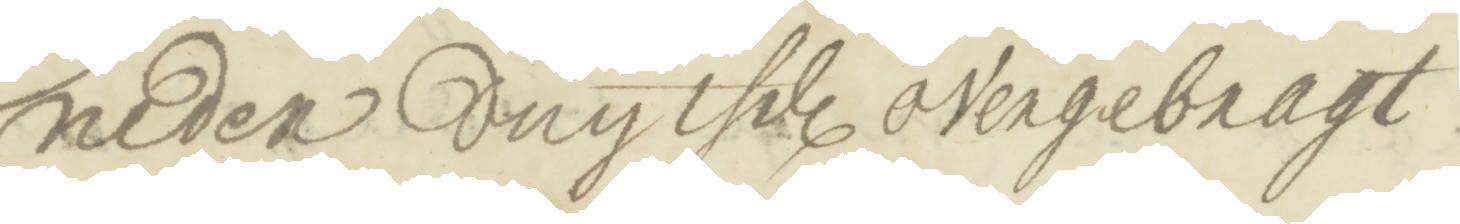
neder duijtsch overgebragt
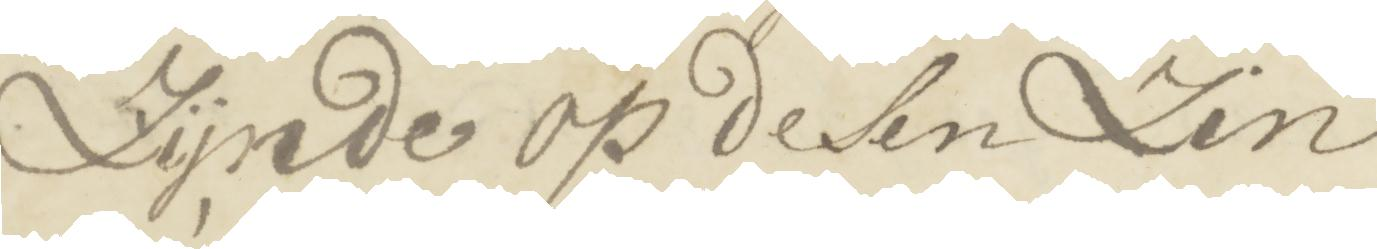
zijnde op desen zin
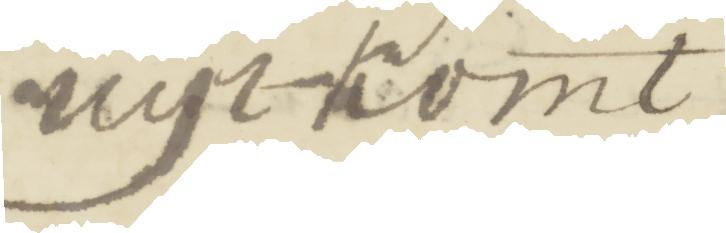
uijt komt
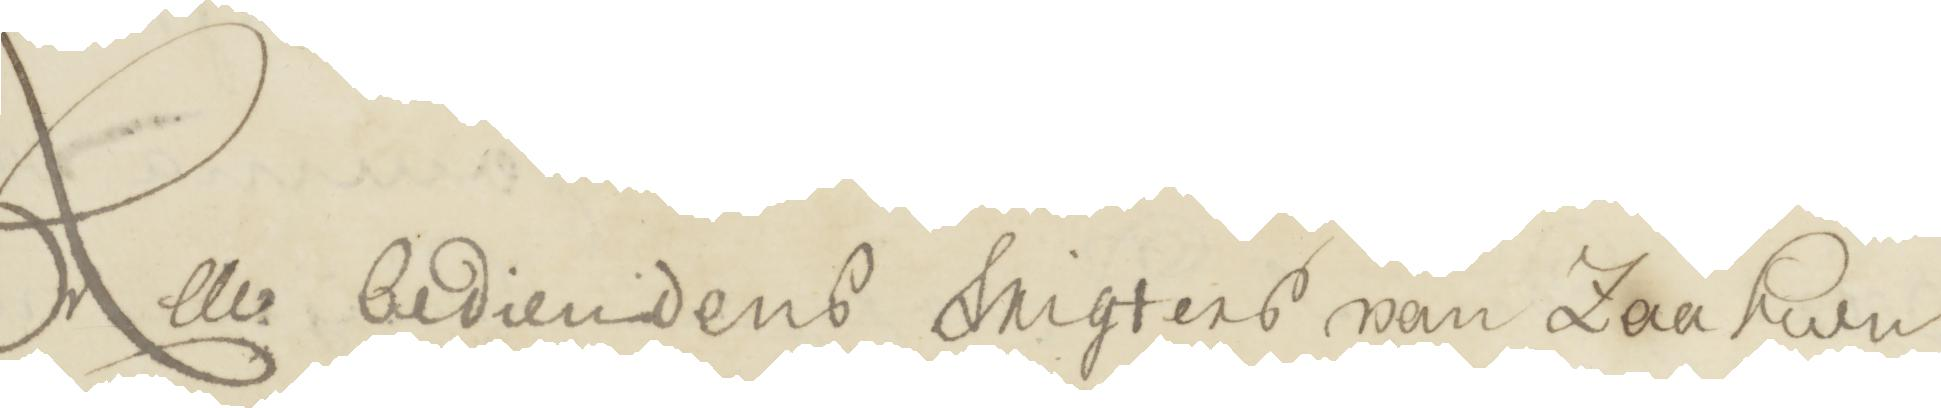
Alle bediendens verrigters van zaaken
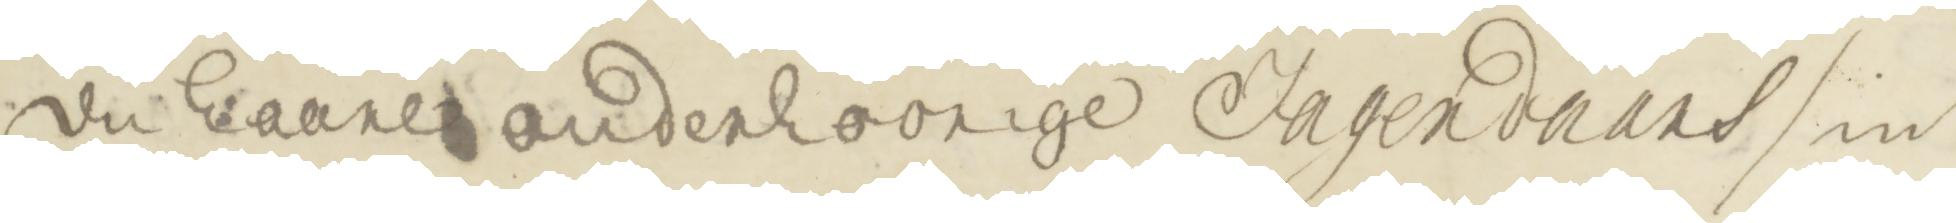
en haare onderhoorige Jager daars / in
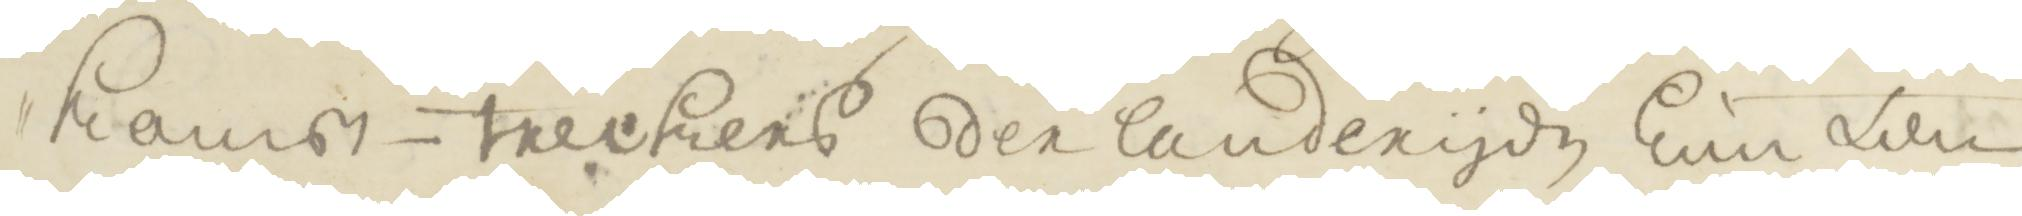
„komst-treckers der landerijen hun ten
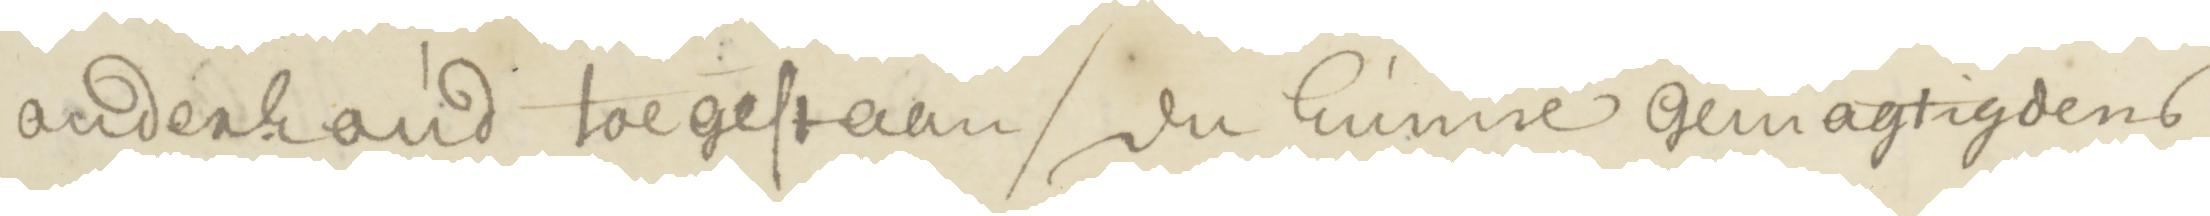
onderhoud toegestaan / en hunne gemagtigdens
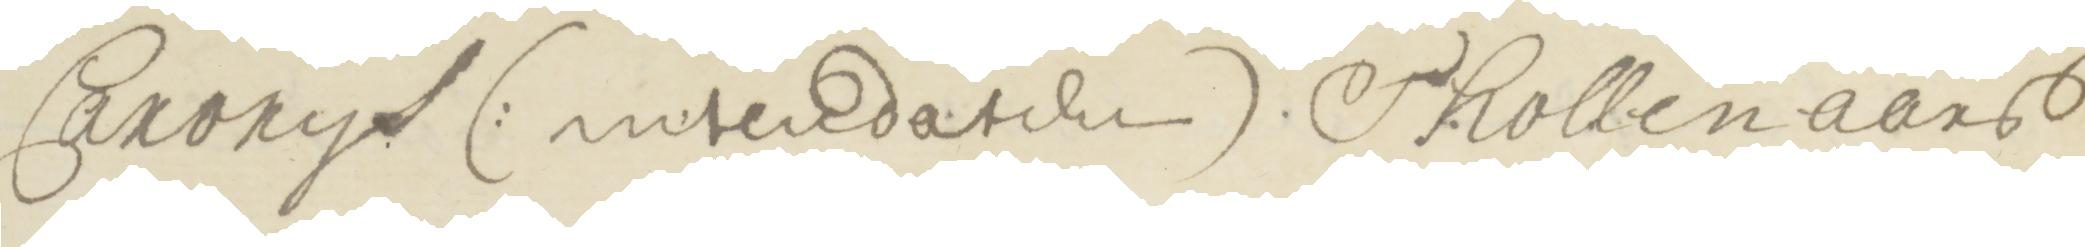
Carorijs (:intendaten) Thollenaars
